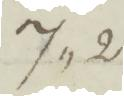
7„ 2
